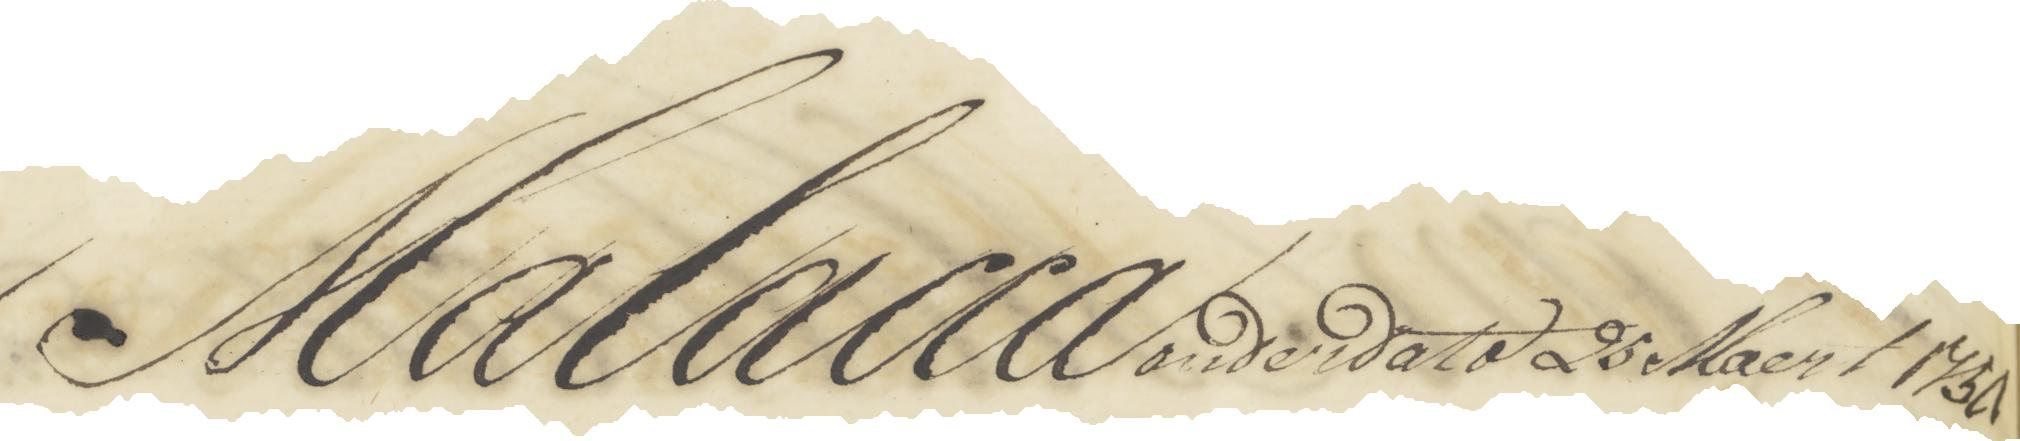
Van Malacca onder dato 25 Maert 1734
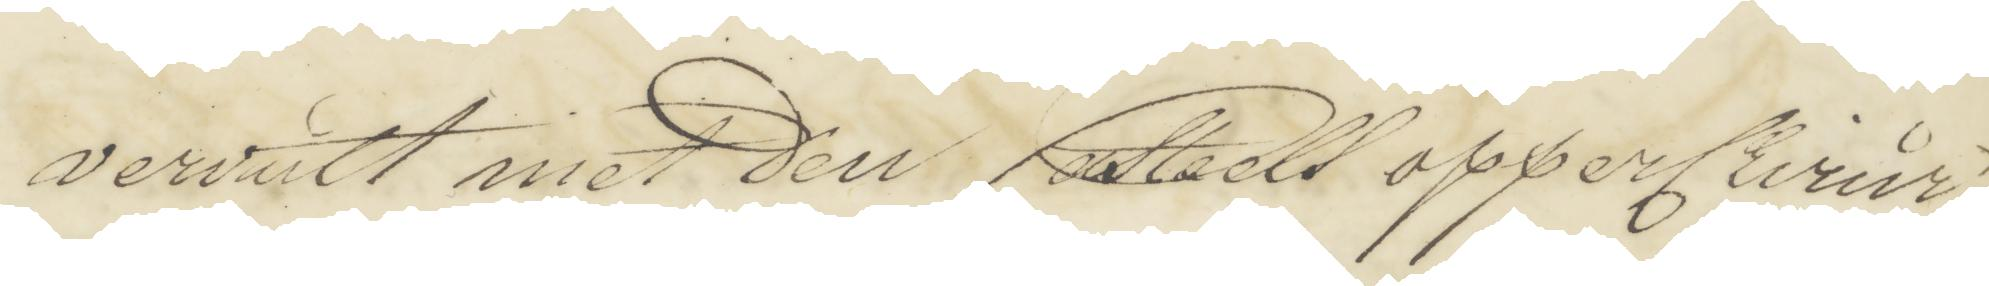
vervult met den Casteels opperchirur„
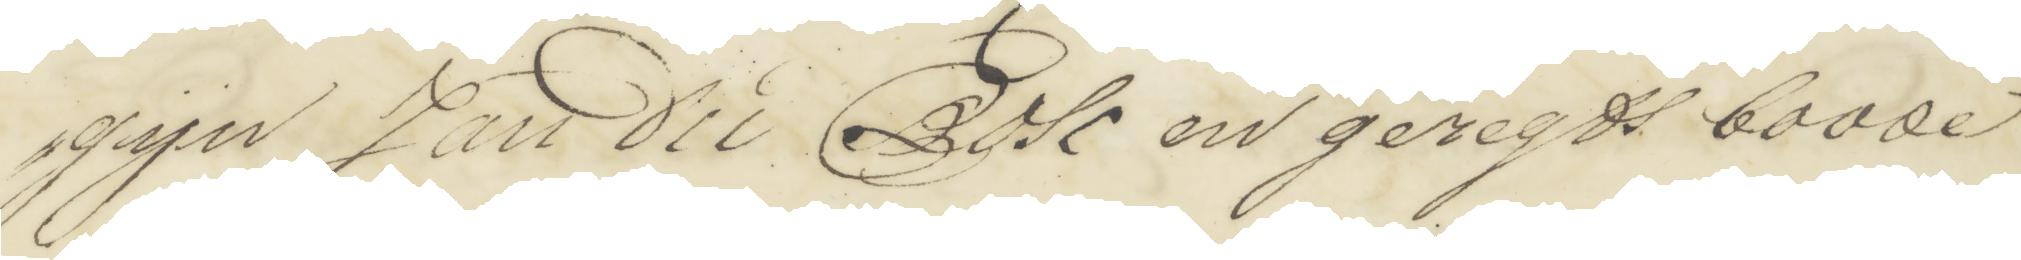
„gijn Jan du Bosc en geregts boode
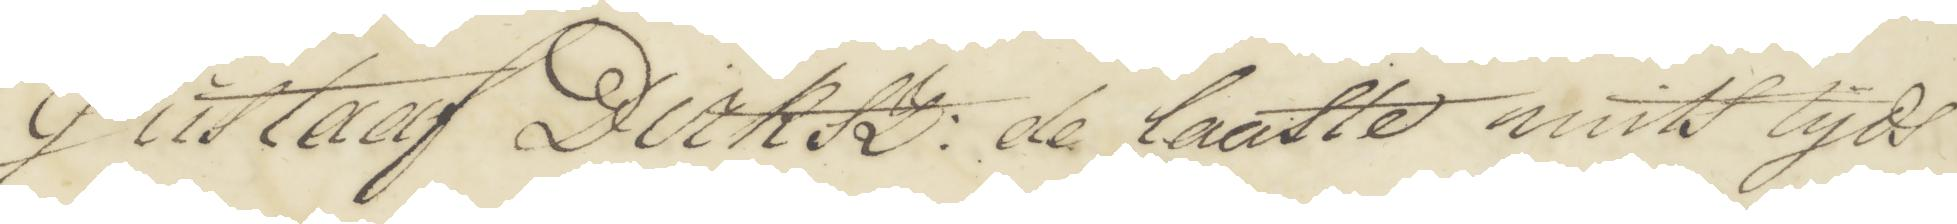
Gustaaf Dirksz: de laaste mits tijds
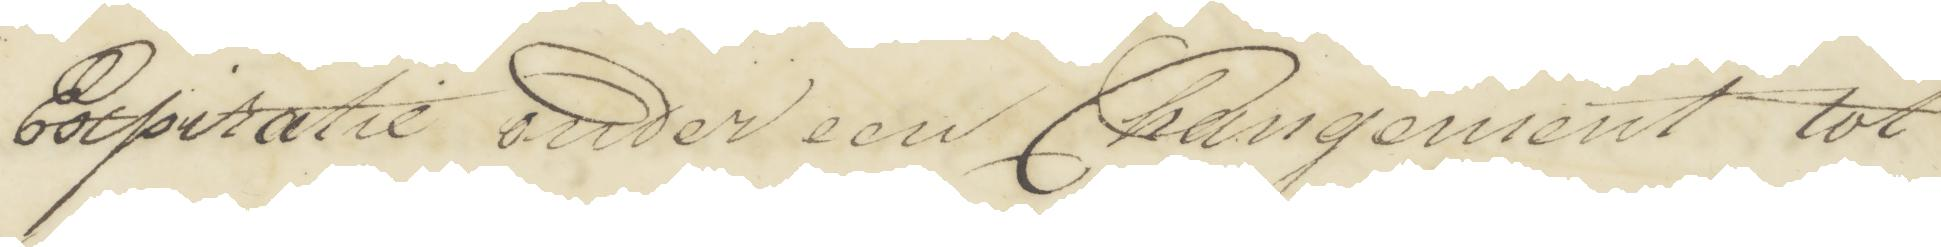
Expiratie onder een Changement tot
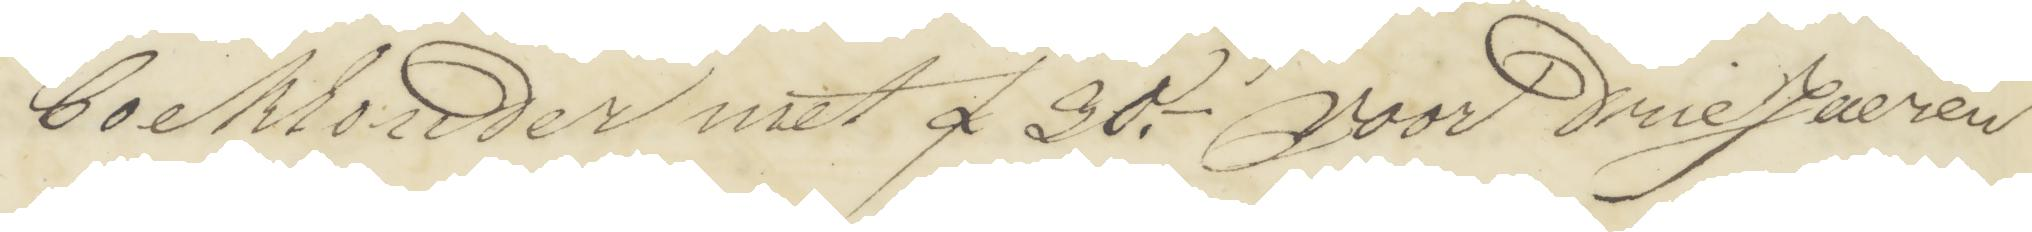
boekhouder met ƒ30.– voor drie Jaeren
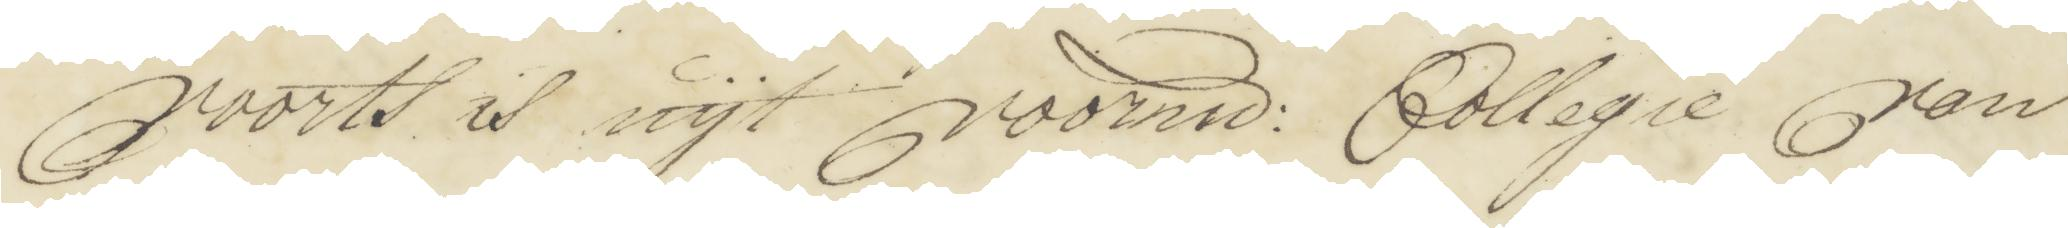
voorts is uijt voormd: Collegie van
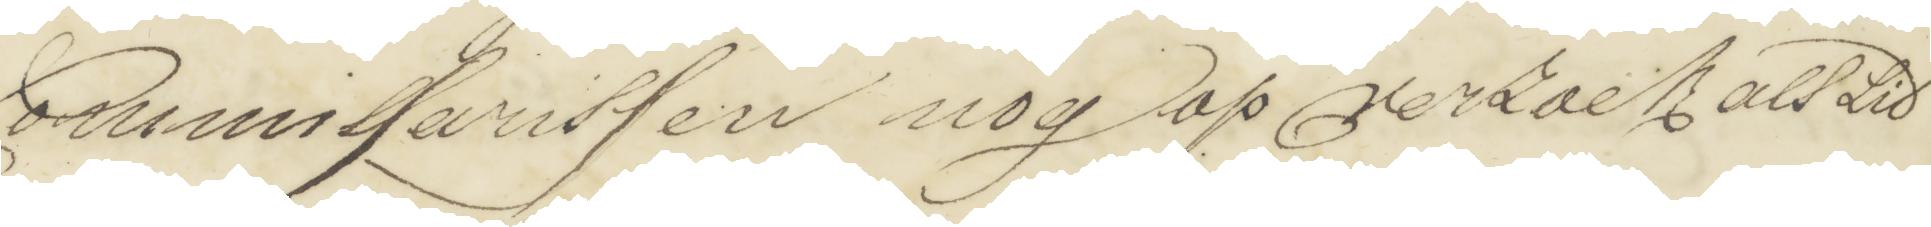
Commissarissen nog op verzoek als lid
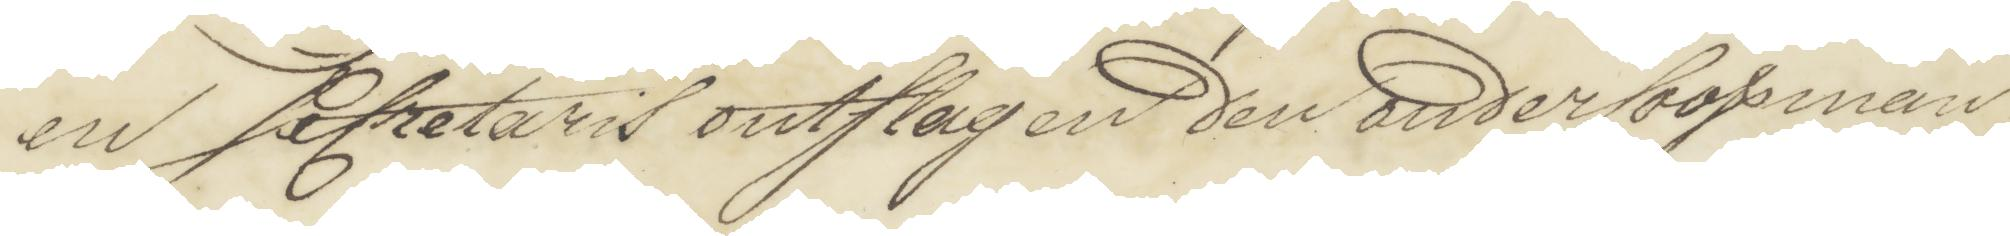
en secretaris ontslagen den ondercoopman
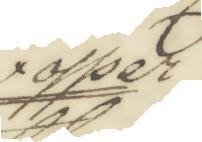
^opper
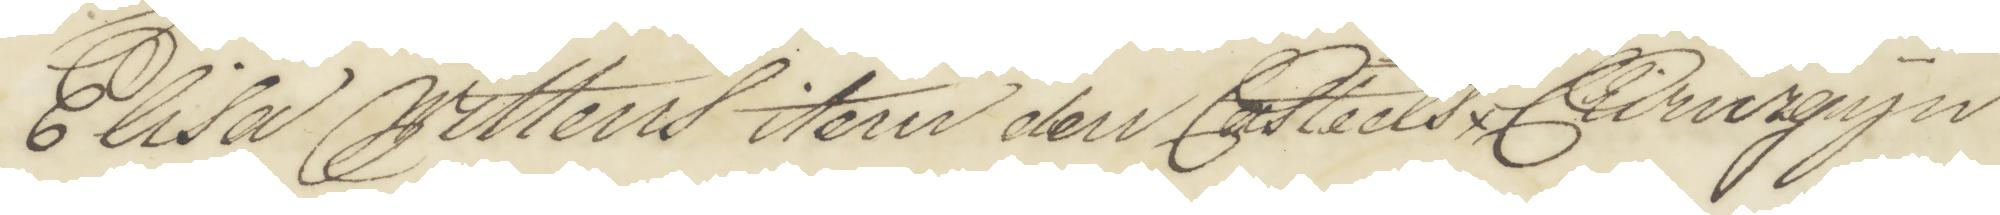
Elisa Wittens item den Casteels ^ Chirurgijn
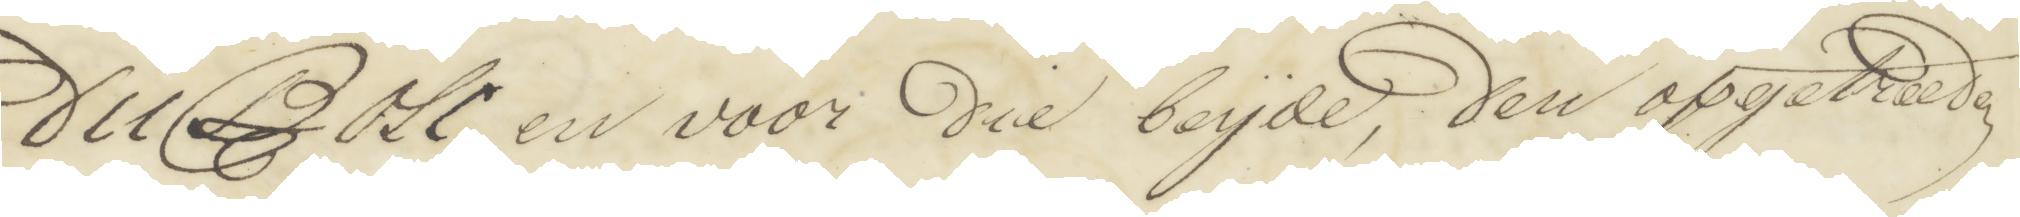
du Bosc, en voor die beijde, den opgetreeden
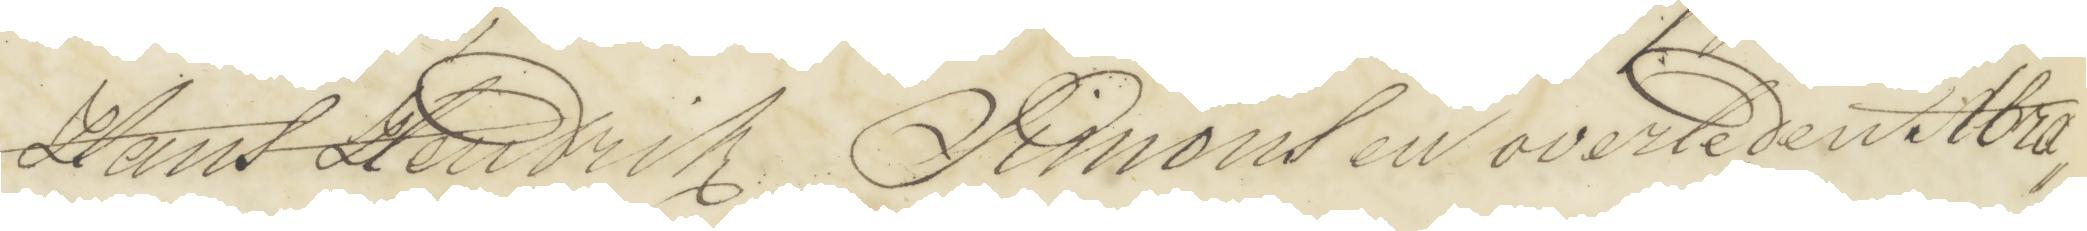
Hans Hendrik Simons en overleden Abra„
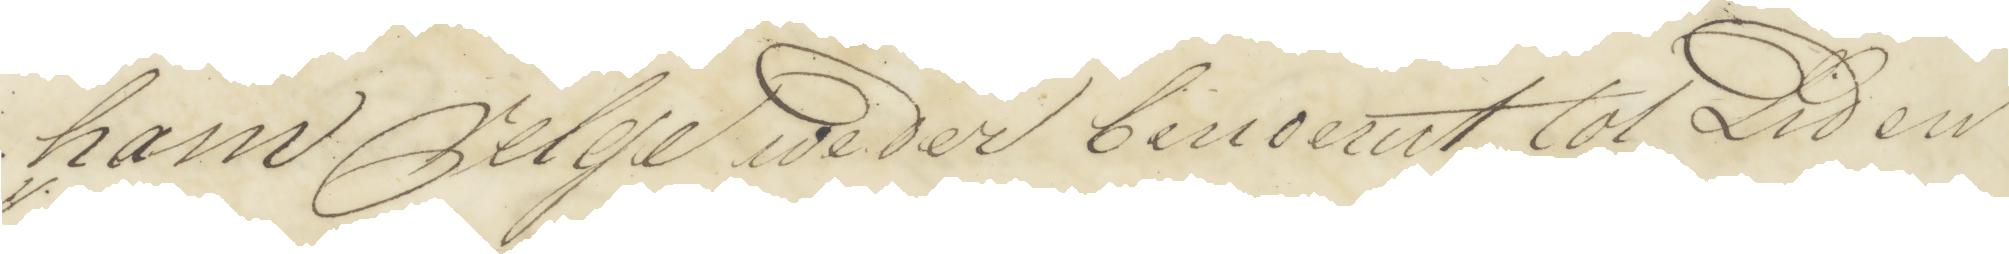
„ham Velge weder benoemt tot lid en
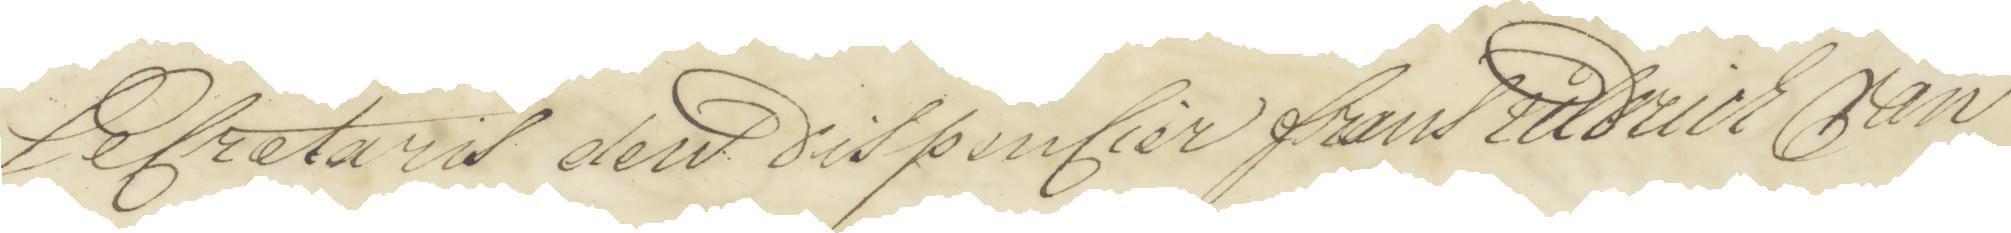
secretaris den dispencier frans uldrich van
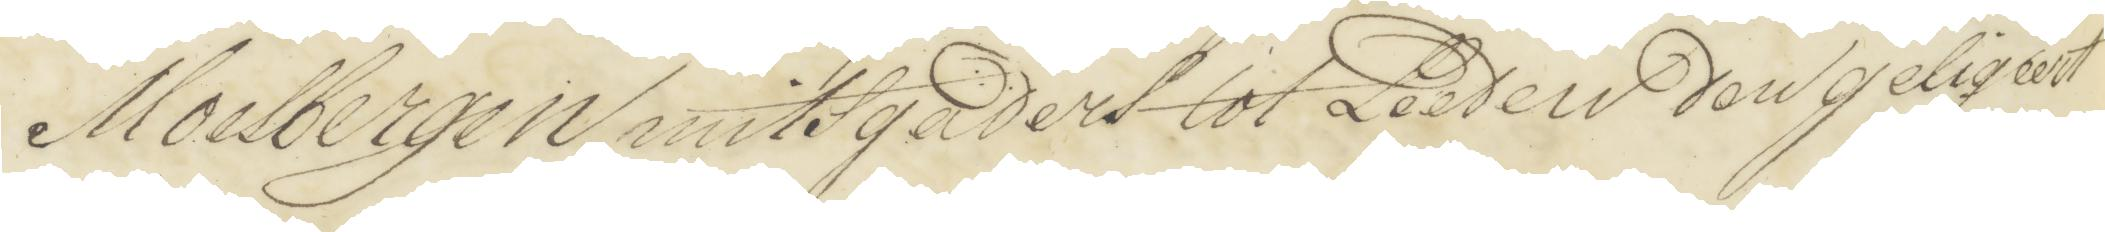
Moesbergen mitsgaders tot leeden den g'eligeert
